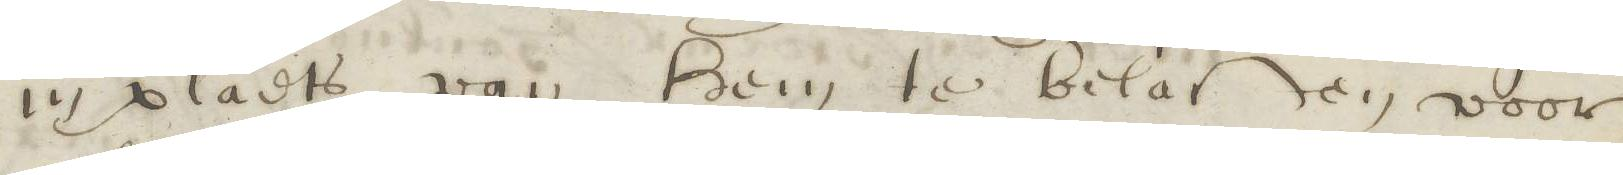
in plaets van hem te belasten voor
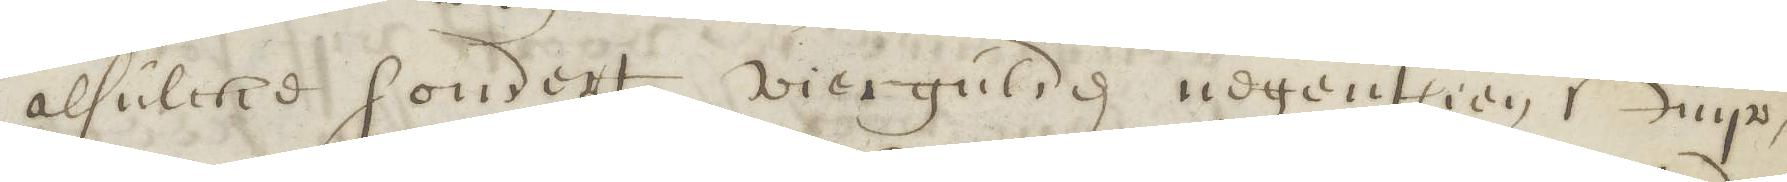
alsulcke hondert vier gulden negenttien stuijv,
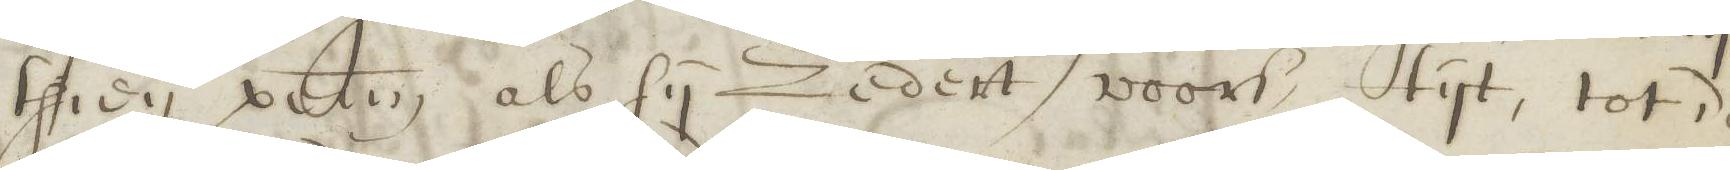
thien penn als hij zedert voorsz tijt, tot den
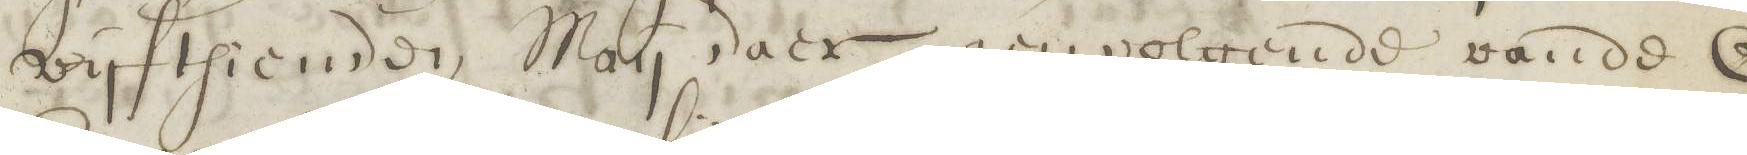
vijfthienden Maij daer aenvolgende van de E
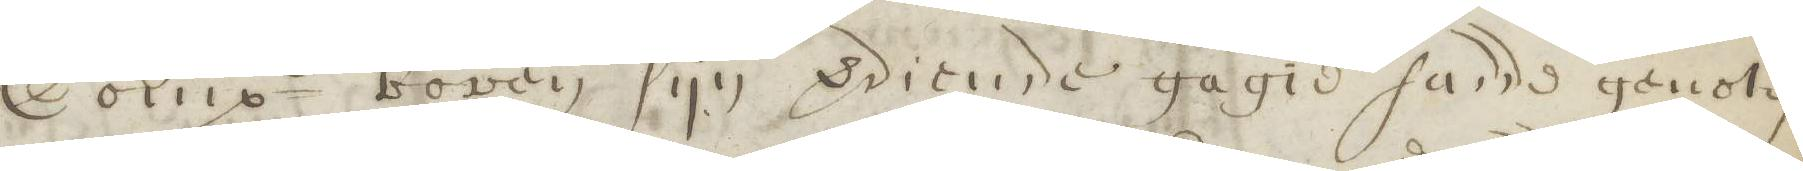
Comp=e boven sijn verdiende gagie hadde genoten
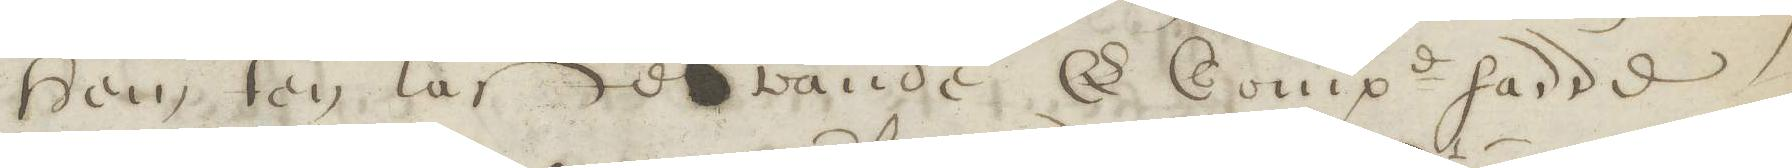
Hem ten laste van de E Comp=e hadde
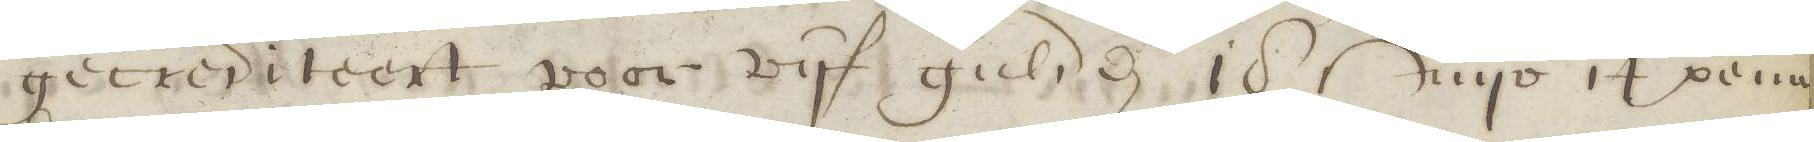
gecrediteert voor vijf gulden 18 stuijv 14 penn
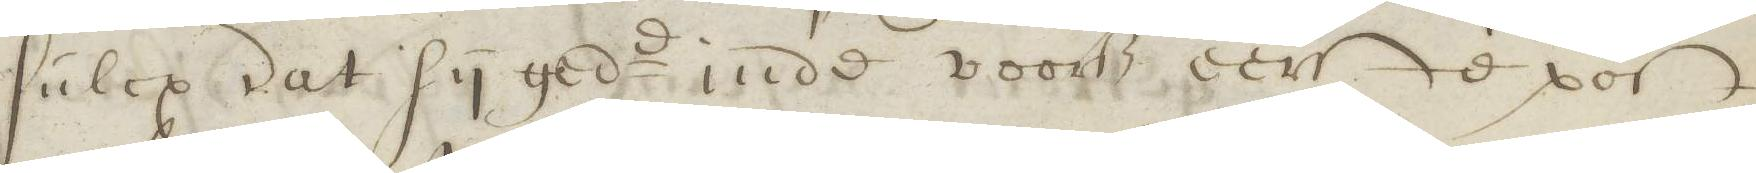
sulcx dat hij ged=e in de voorsz eerste post
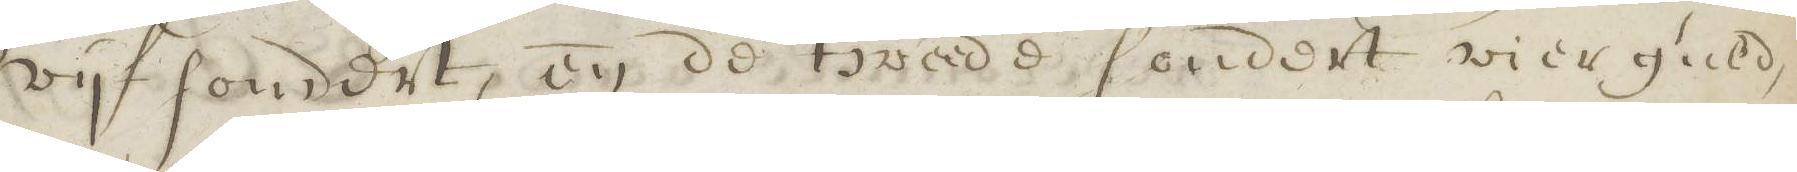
vijf hondert, en de tweede hondert vier guld,
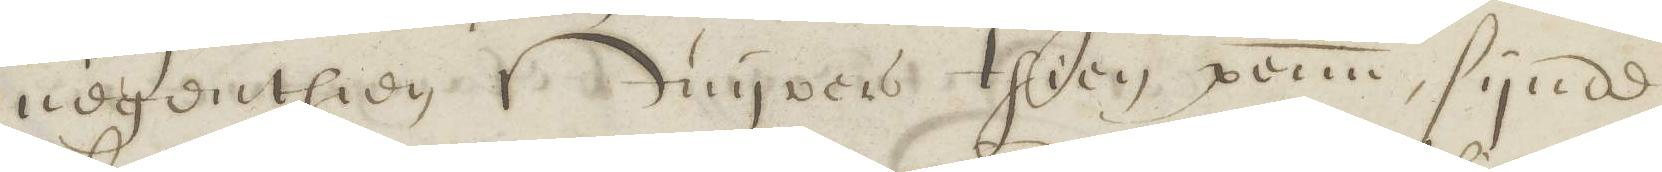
negenthien stuijvers thien penn, sijnde
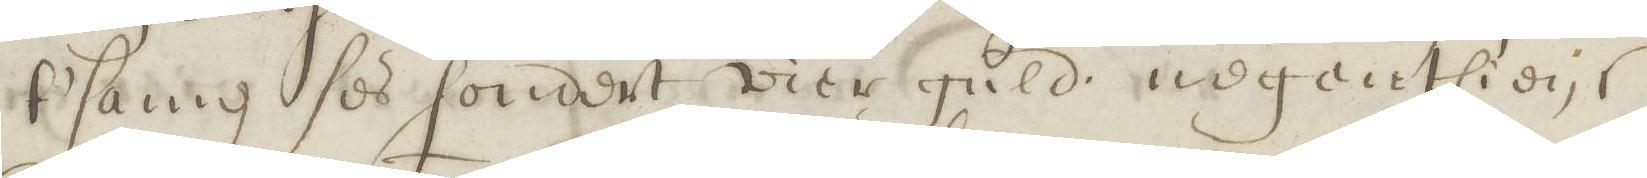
tesame ses hondert vier guld. negenthien st
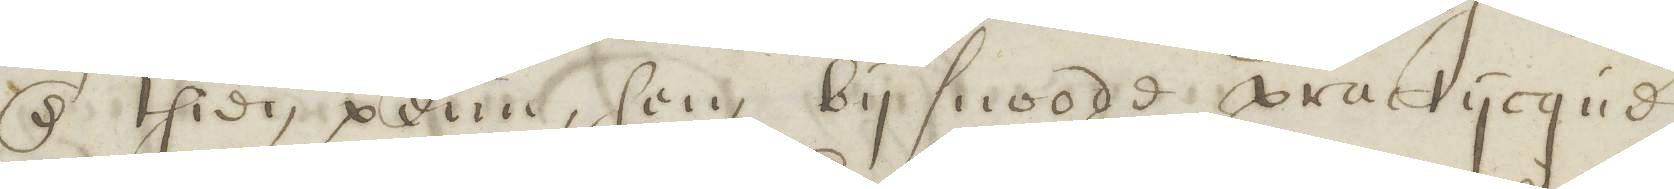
ende thien penn, hem bij snoode practijcque
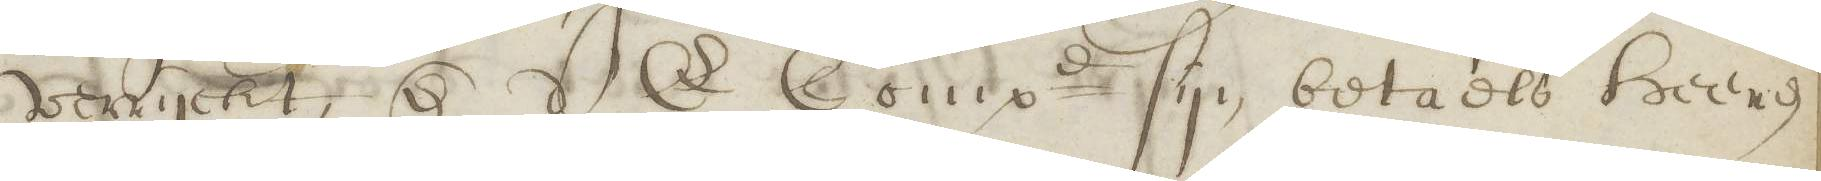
verrijckt, ende d' E Comp=e sijn betaeld heeren
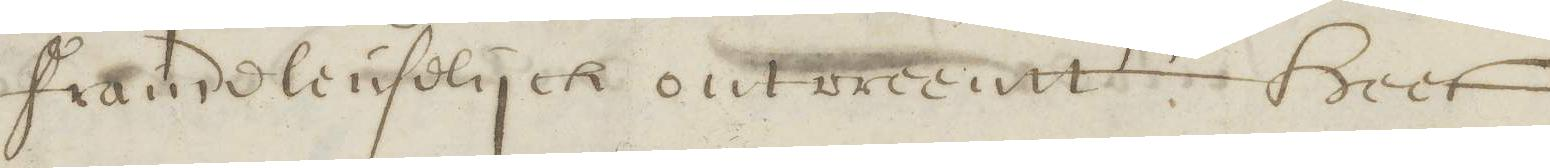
fraudeleuselijck ontvreemt heeft
